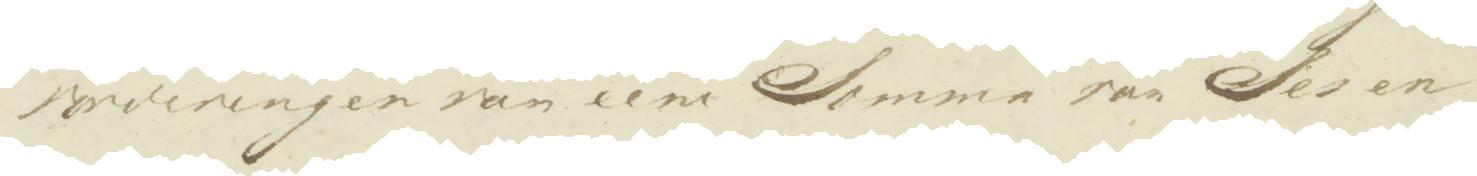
vorderingen van eene Somma van Ses en
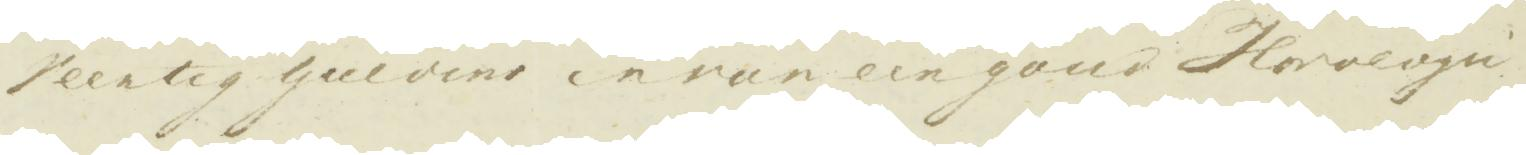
Veertig guldens en van een goud Horologie
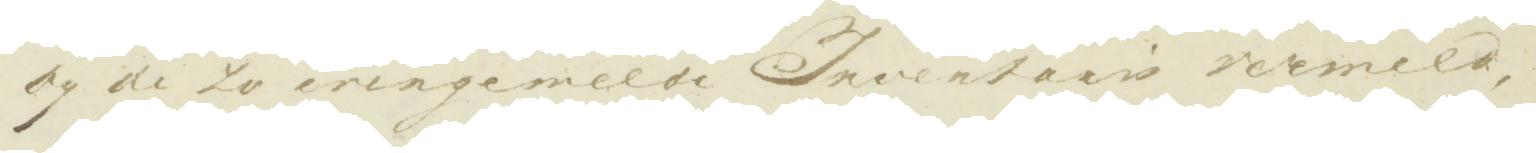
by de zo even gemelde Inventaris vermeld,
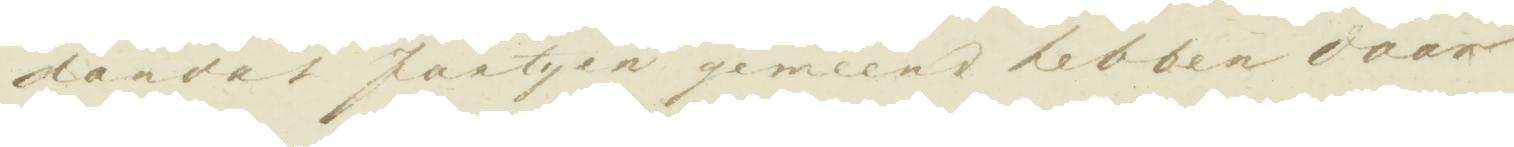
dan dat partyen gemeend hebben daar
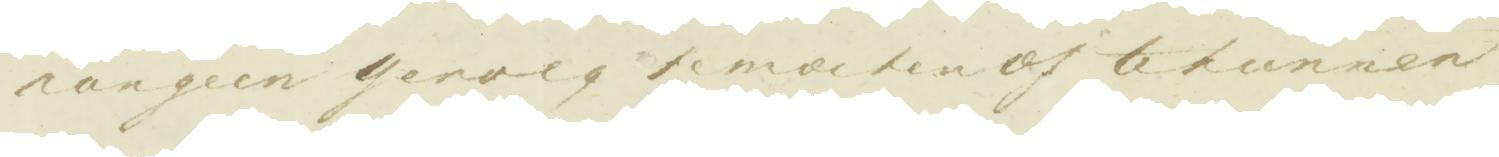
aan geen gevolg te moeten of te kunnen
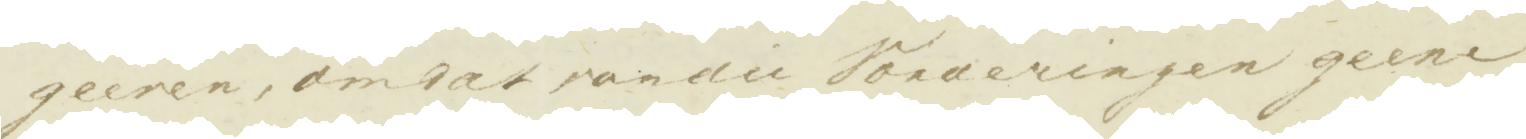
geeven, omdat van die Vorderingen geene
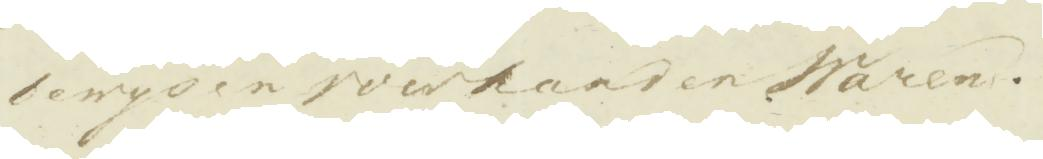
bewysen voorhanden waren.
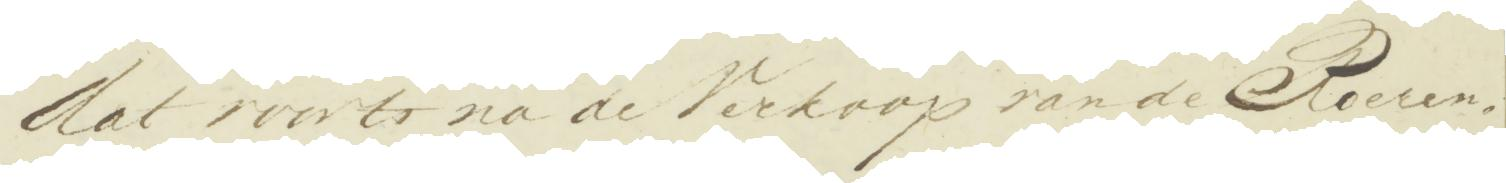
dat voorts na de Verkoop van de Roeren„
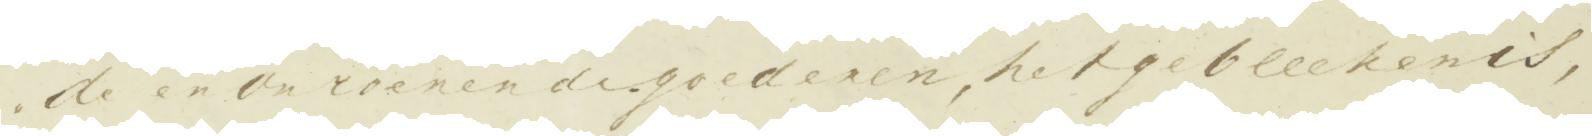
„de en on roerende goederen, het gebleeken is,
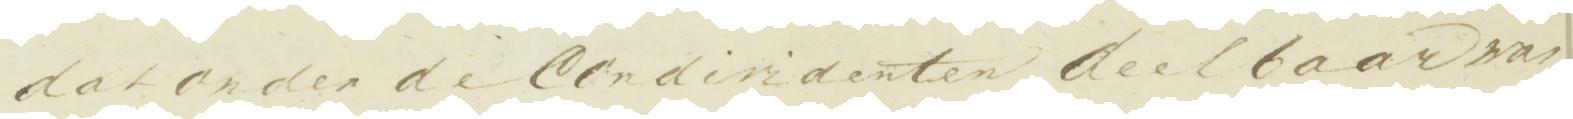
dat onder de condividenten deelbaar was
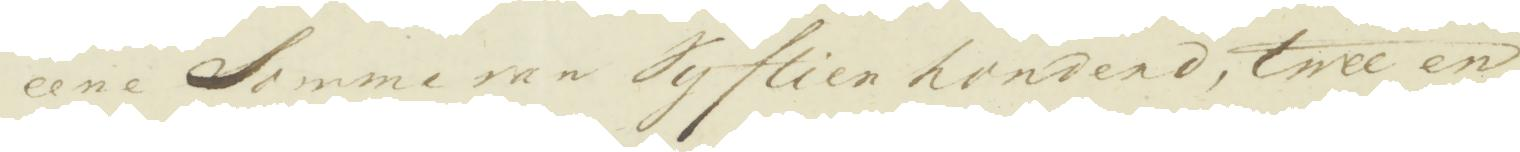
eene Somme van Vyftien honderd, twee en
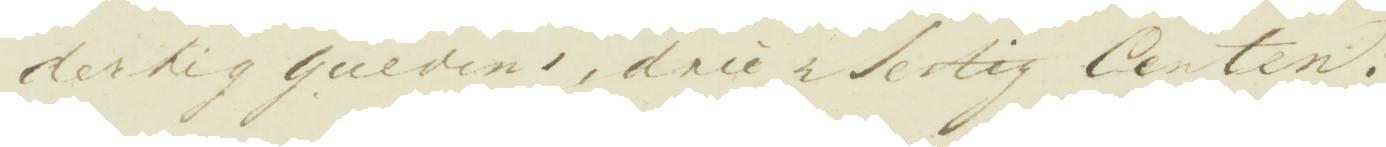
dertig guldens, drie en sestig Centen.
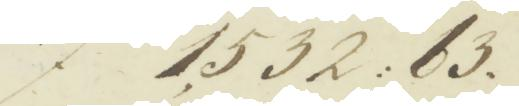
ƒ 1,532:63.
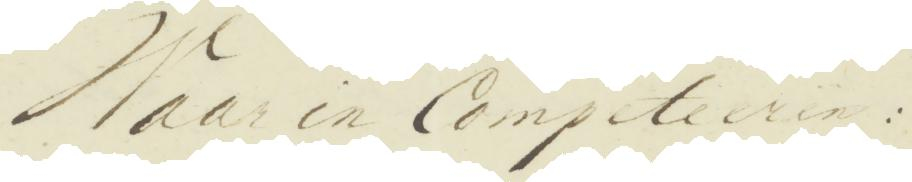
Waar in Competeeren:
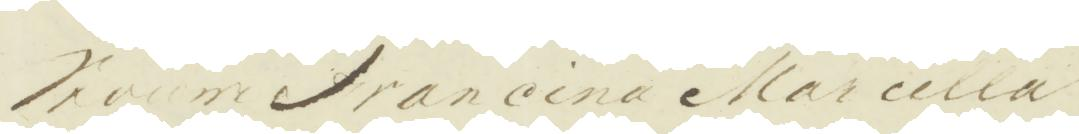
Vrouwe Francina Marcella
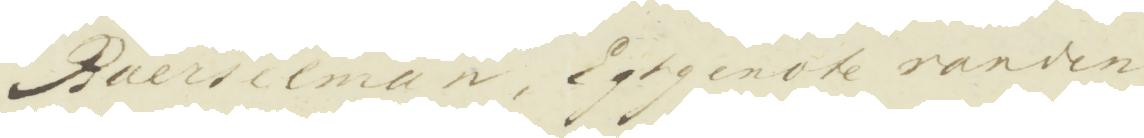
Baerselman, Egtgenote vanden
